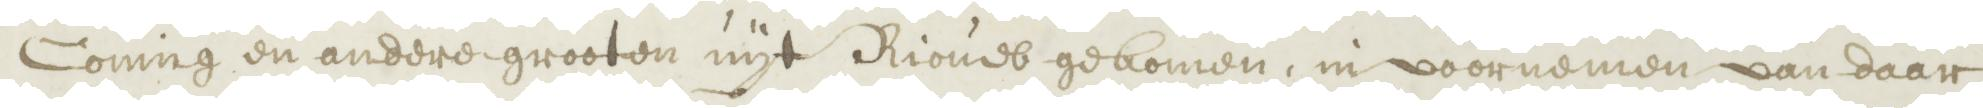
Coning en andere grooten uijt Riouw gekomen, in voornemen van daar
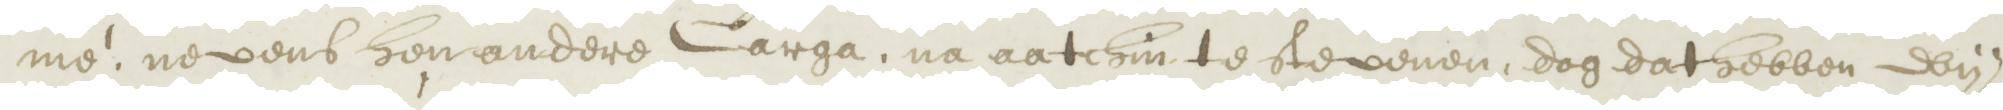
me! nevens hen andere Carga, na aatchin te stevenen, dog dat hebben wij
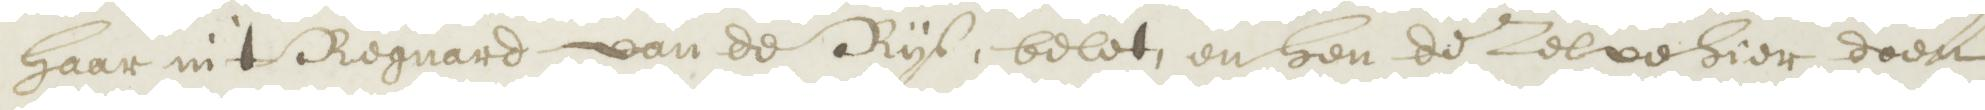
haar in ’t Reguard van de Rijs, belet, en hen de zelve hier doen
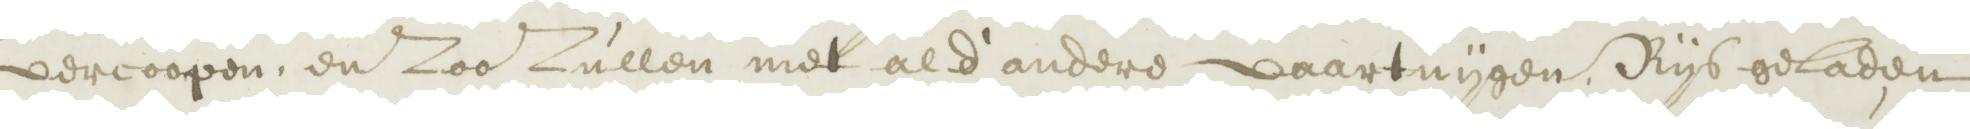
vercoopen, en zoo zullen met al d'andere vaartuijgen, Rijs geladen
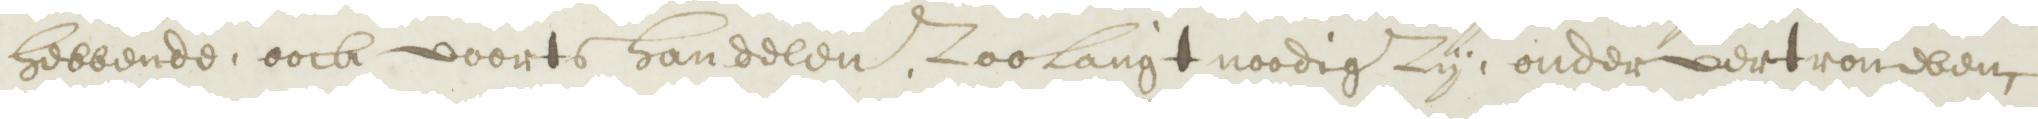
hebbende, oock voorts handelen, zoolang 't noodig zij, onder vertrouwen,
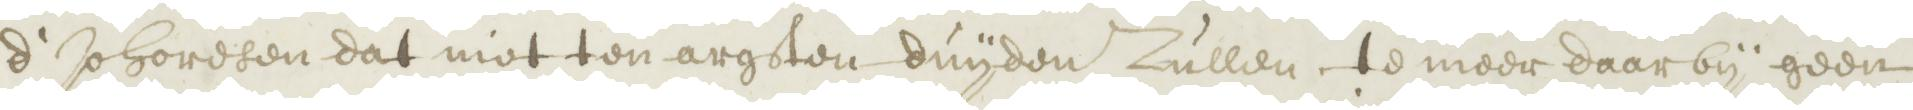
d’ Johoresen dat niet ten argsten duijden zullen te meer daarbij geen
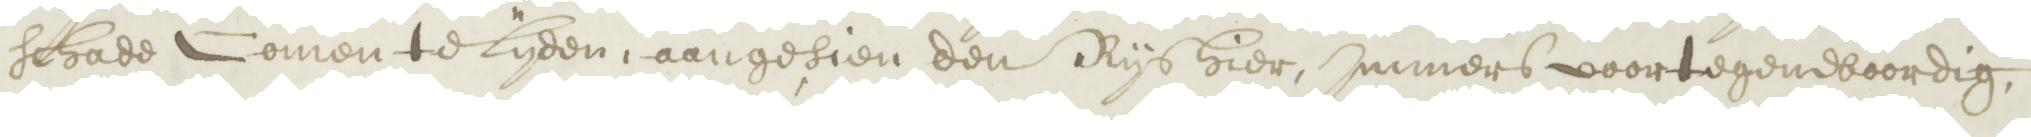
schade comen te lijden, aangesien den Rijs hier, Jmmers voor tegenwoordig,
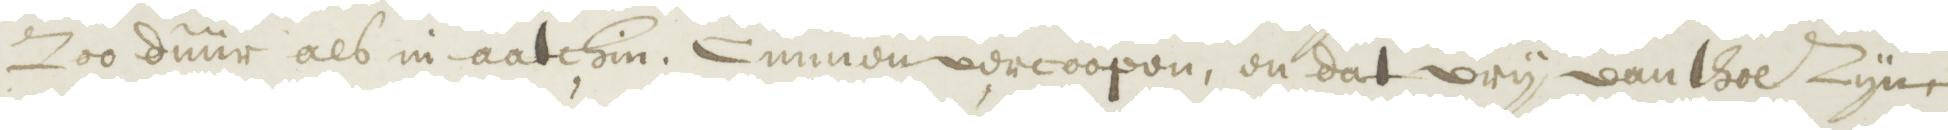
zoo duur als in aatchin. Cunnen vercoopen, en dat vrij van thoe zijn,
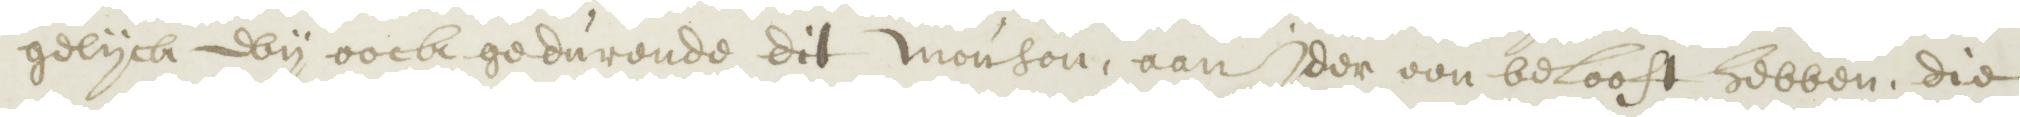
gelijck wij oock gedurende dit mouson, aan Jder een belooft hebben, die
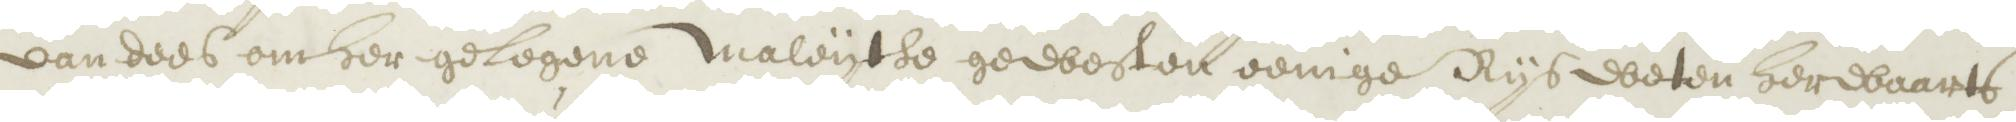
van dees om her gelegene maleijtse gewesten eenige Rijs weten herwaarts
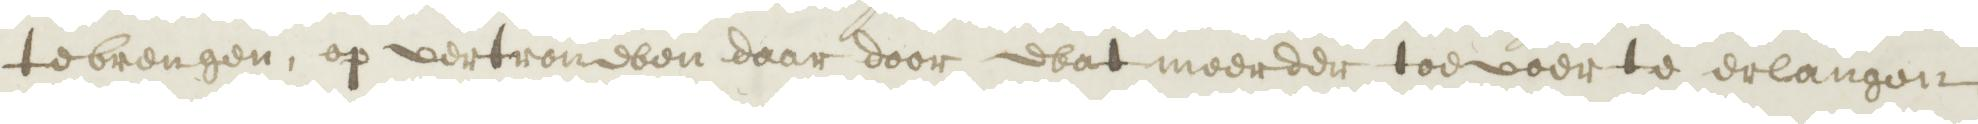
te brengen, op vertrouwen daar door wat meerder toevoer te erlangen,
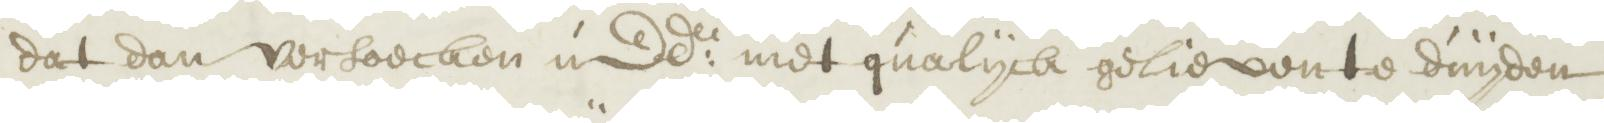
dat dan versoecken u Ed:le niet qualijck gelieven te duijden
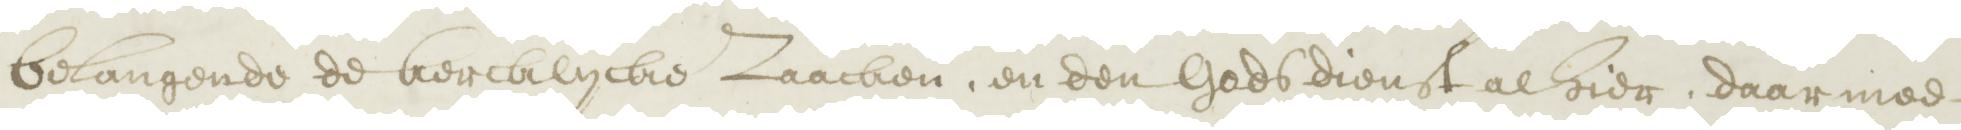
belangende de kercklijcke zaacken, en den godsdienst alhier, daar mee
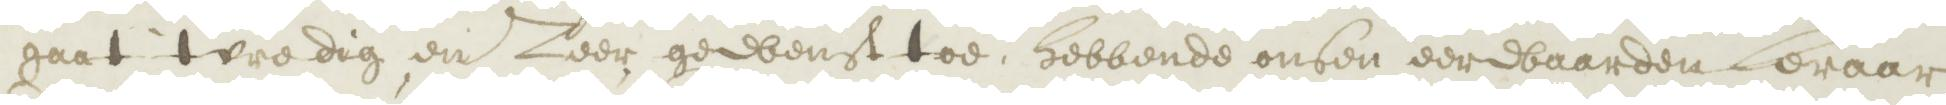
gaat 't vredig en zeer gewenst toe, hebbende onsen eerwaarden leraar
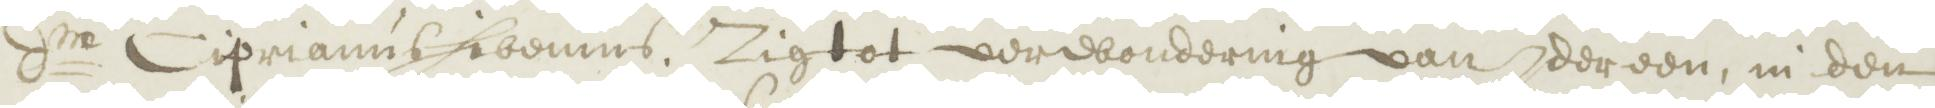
d=ne Ciprianus sibenius, zig tot verwondering van Jder een, in den
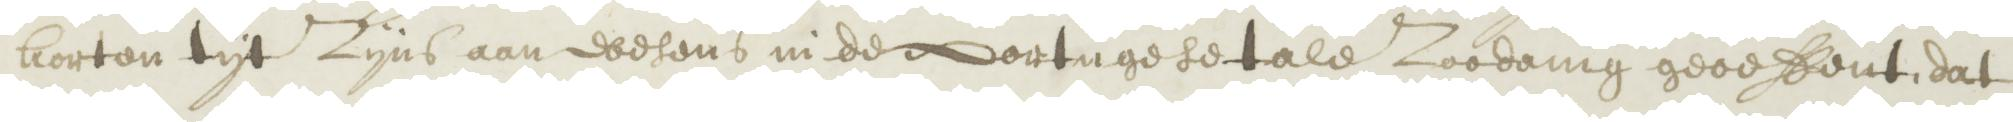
korten tijt zijns aan wesens in de portugese tale zoodanig geoeffent, dat
